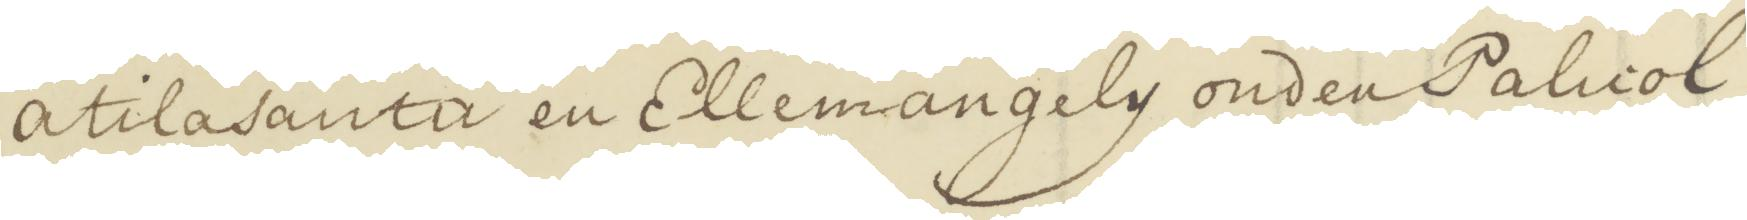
atilasanta en Ellemangely onder Palicol
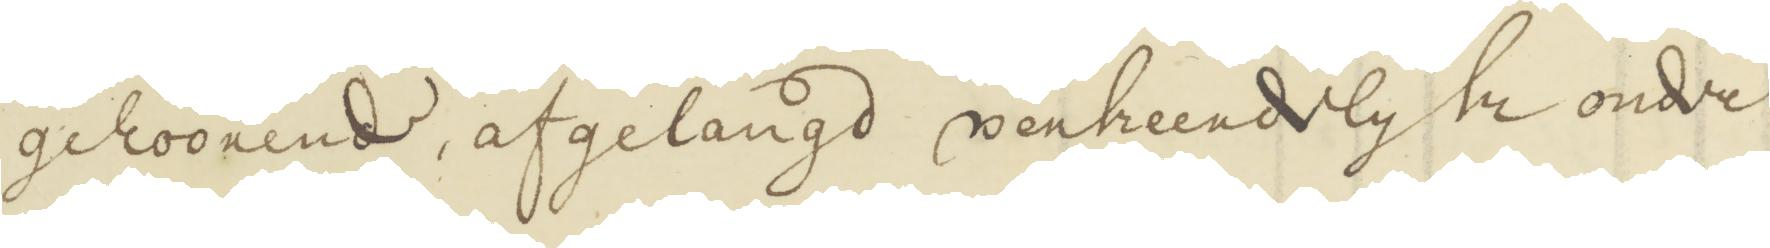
gehoorende, afgelangd verkeerdelyk onder
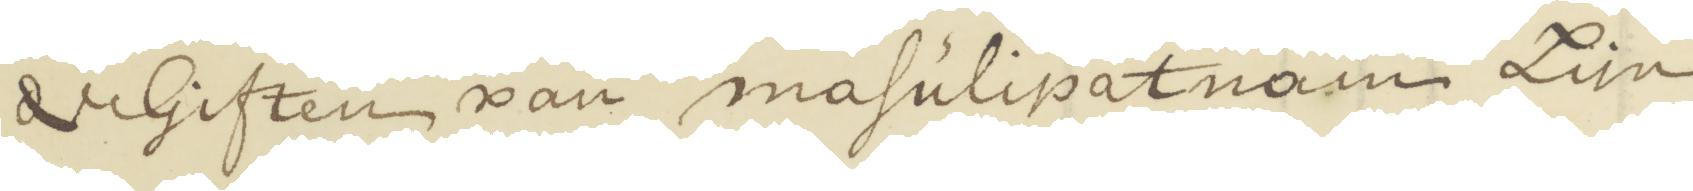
de Giften van masulipatnam zijn
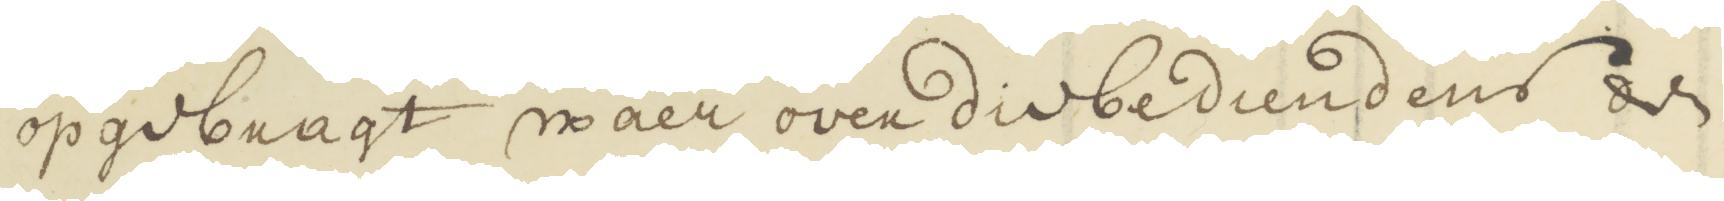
opgebragt waer over die bediendens den
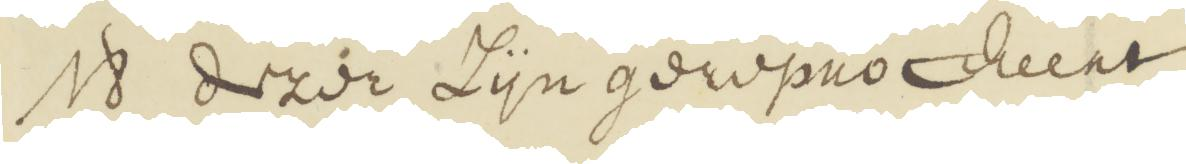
18 dezer zijn gereprocheert
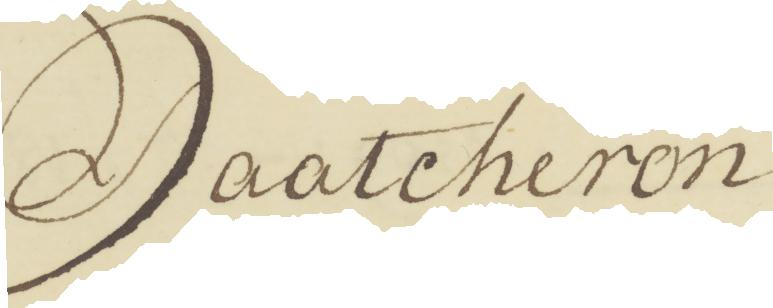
Daatcheron
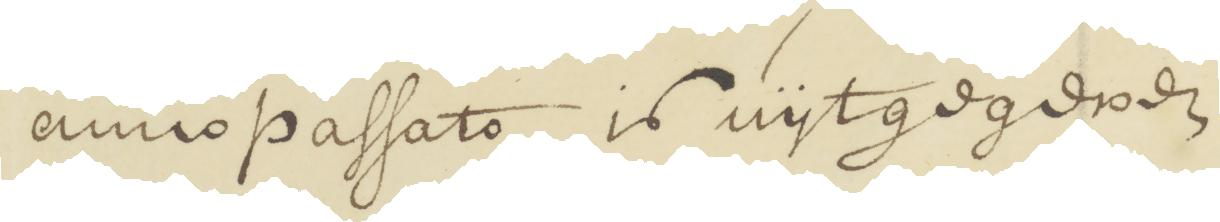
anno passato is uijtgegeven
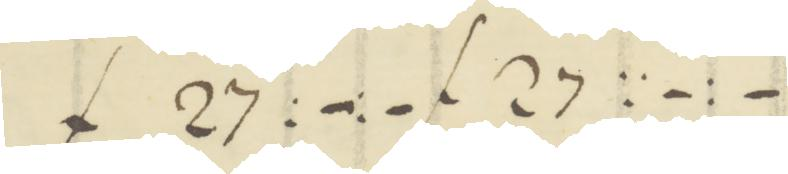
ƒ 27: —: — ƒ 27: —: —
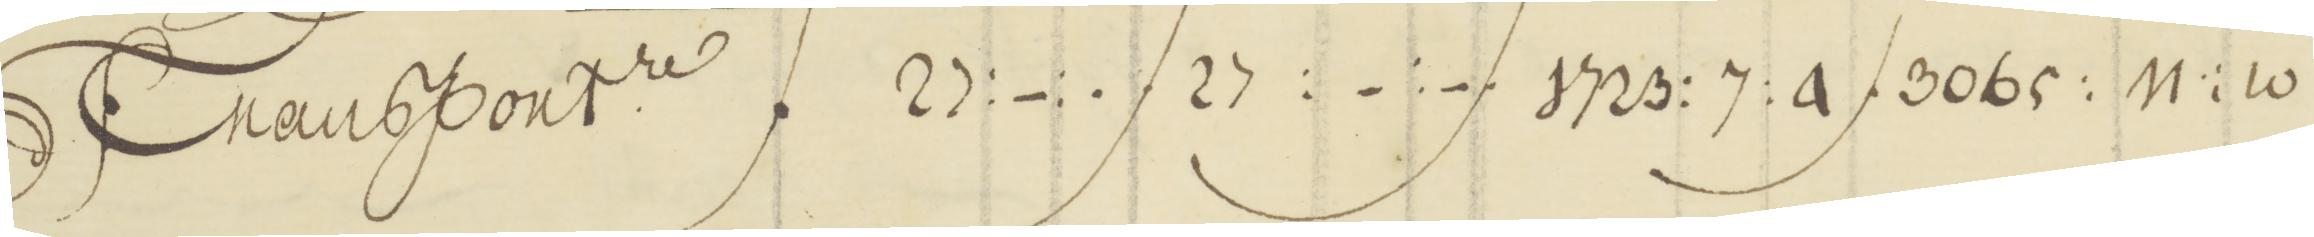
Transport.re ƒ 27: —: — ƒ 27: —: — ƒ 1723: 7: 4 ƒ 3065: 11: 10
